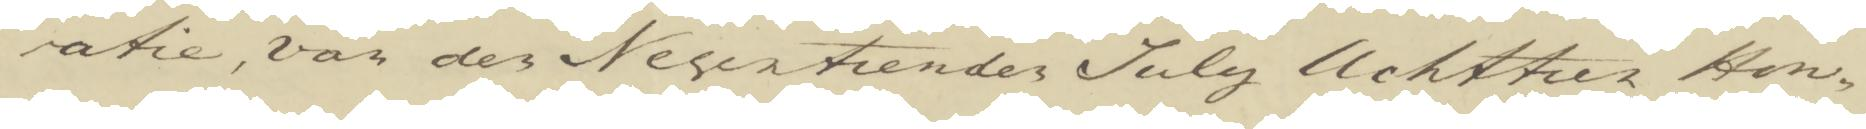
ratie, van den Negentienden July Achttien Hon„
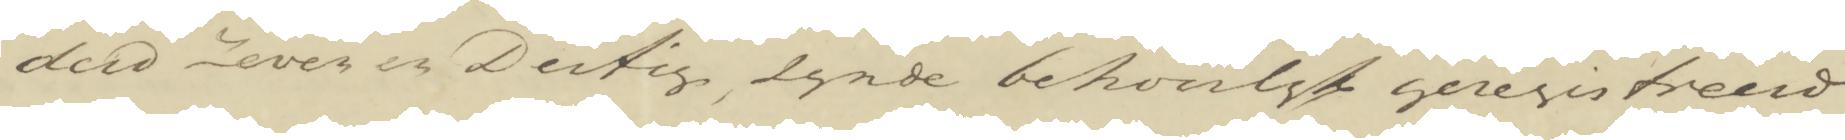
derd zeven en Dertig, zynde behoorlyk geregistreerd
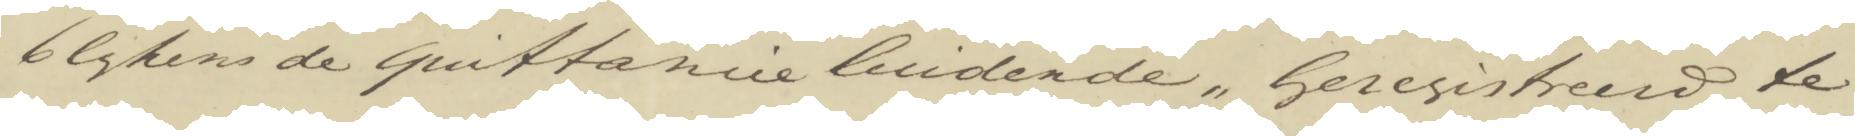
blykens de quittancie luidende „ Geregistreerd te
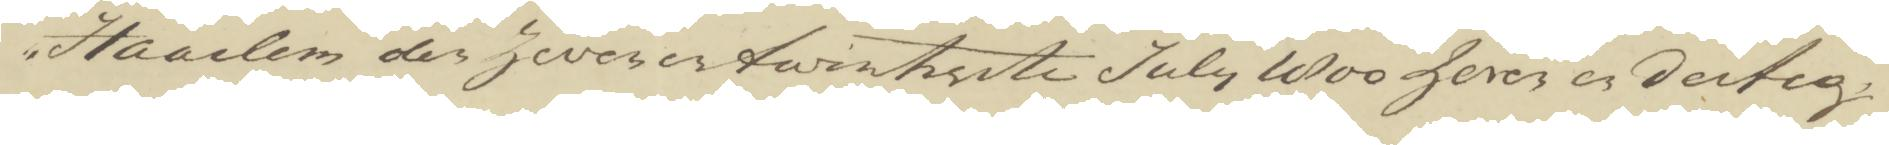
„ Haarlem den Zeven en twintigste July 1800 Zeven en dertig
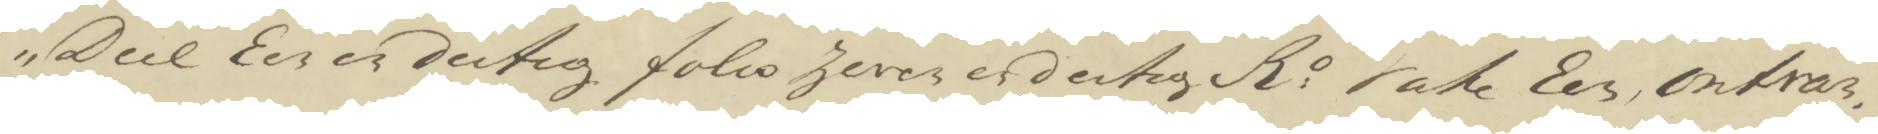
„ Deel Een en dertig folio Zeven en dertig R:o vak Een, ontvan,
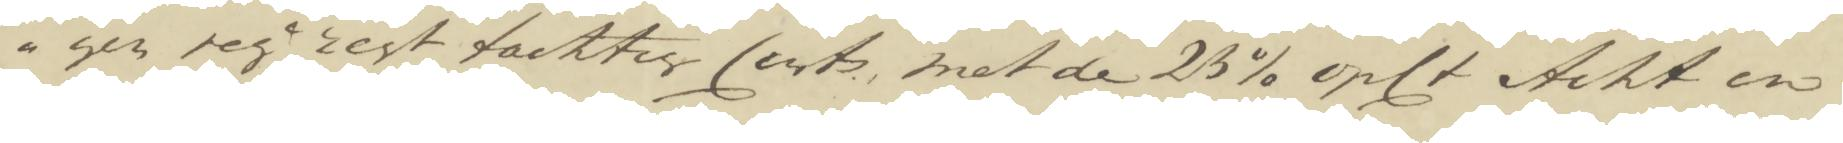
„ gen regl regt tachtig Cents, met de 23% opCt Acht en
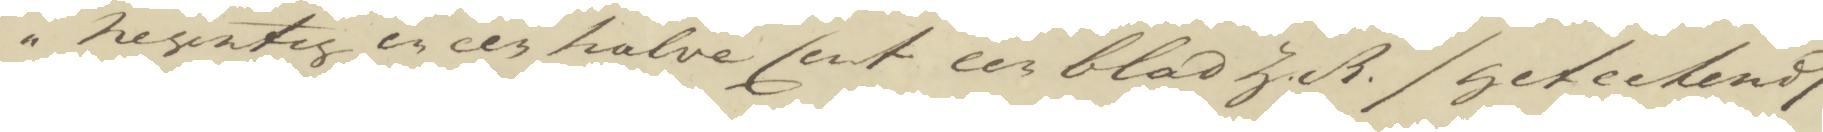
„ negentig in een halve Cent een blad Z.R. /geteekend/
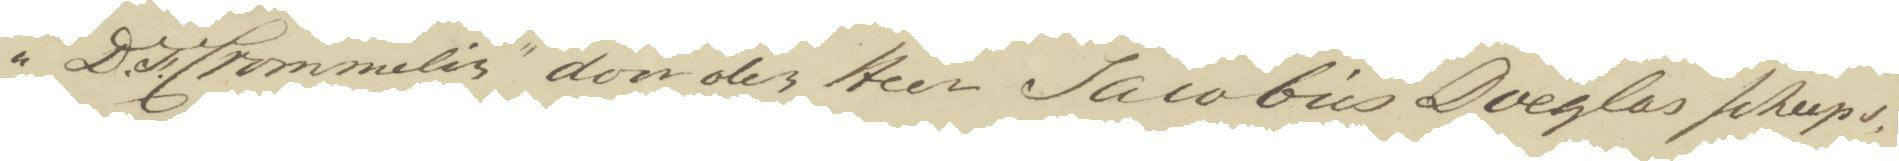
„ D.F. Crommelin door den Heer Jacobus Doeglas scheeps,
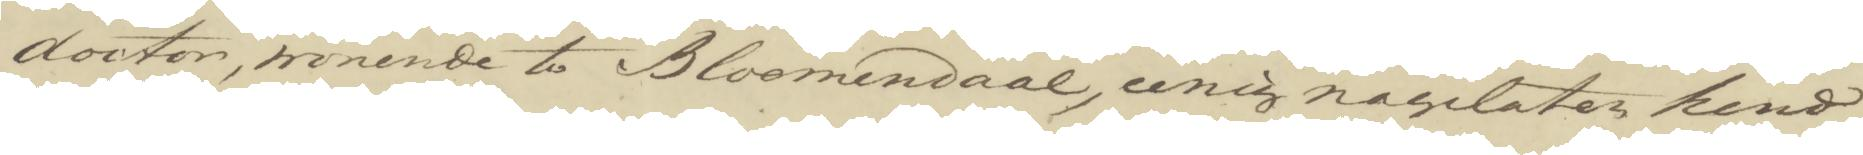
doctor, wonende te Bloemendaal, eenig nagelaten kind
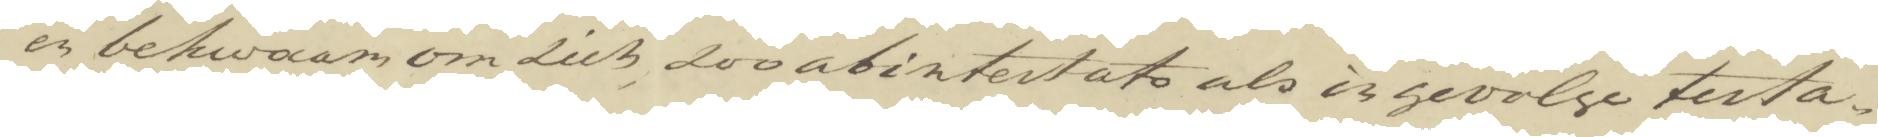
en bekwaam om zich, zoo ab intestato als in gevolge testa=
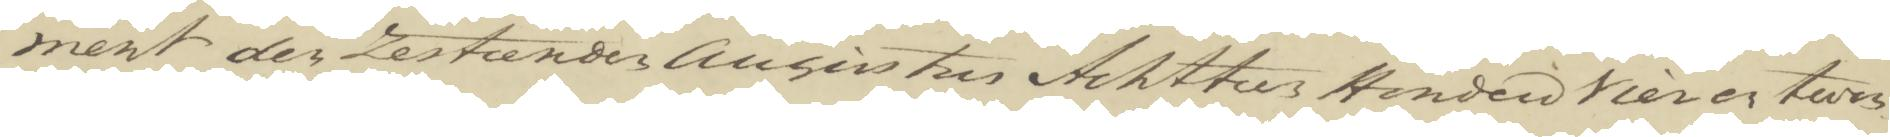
ment den zestienden Augustus Achttien Honderd Vier en twin
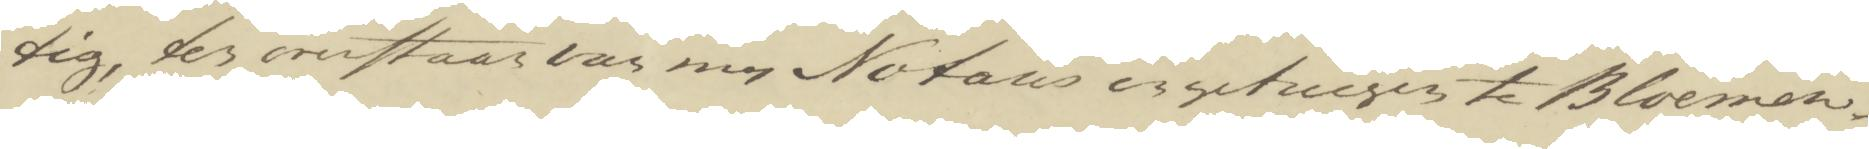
tig, ten overstaan van my Notaris en getuigen te Bloemen„
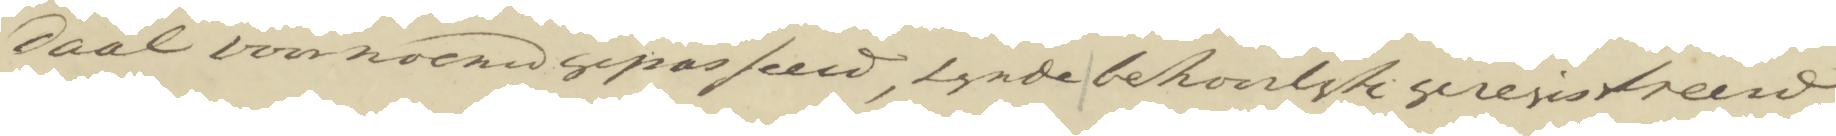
daal voornoemd gepasseerd, zynde behoorlyk geregistreerd,
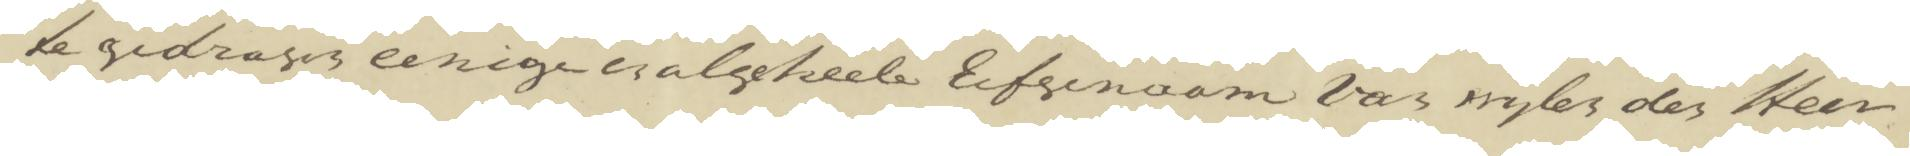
te gedragen eenige en algeheele Erfgenaam van wylen den Heer
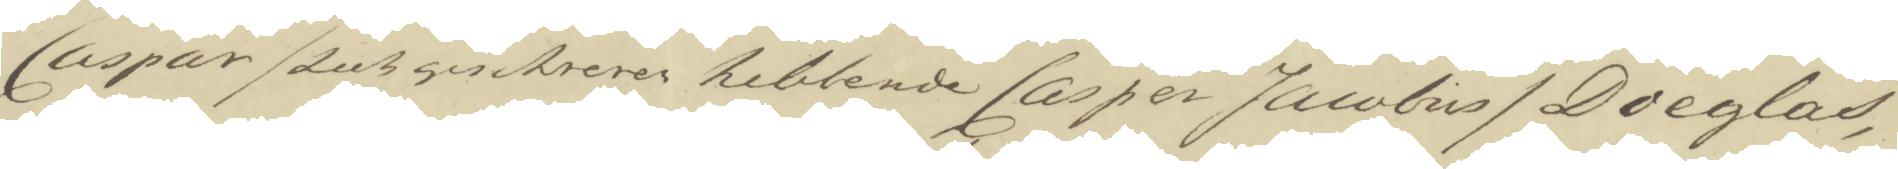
Caspar / zich geschreven hebbende Casper Jacobus / Doeglas,
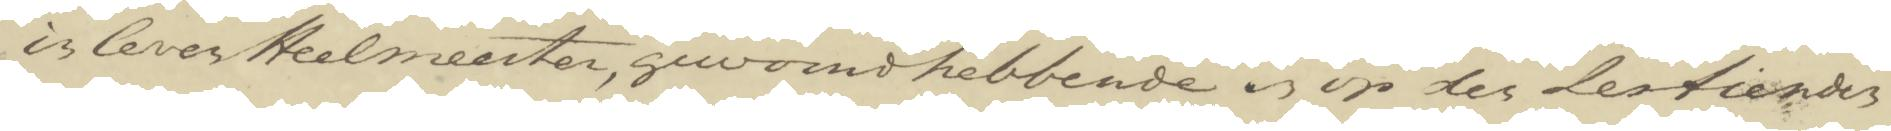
in leven Heelmeester, gewoond hebbende en op den Zestienden
